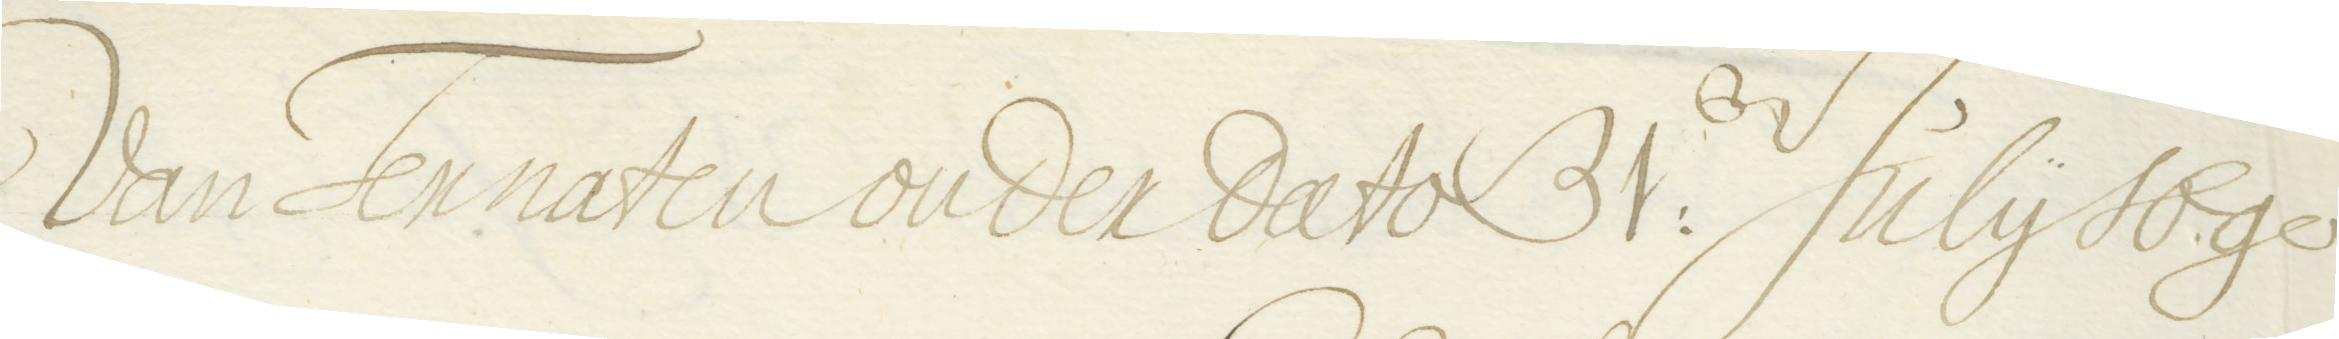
Van Ternaten onder dato 31:en Julij 1690
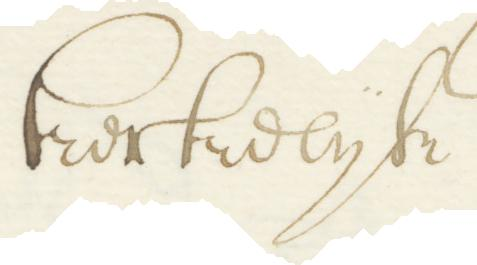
kerkelijk
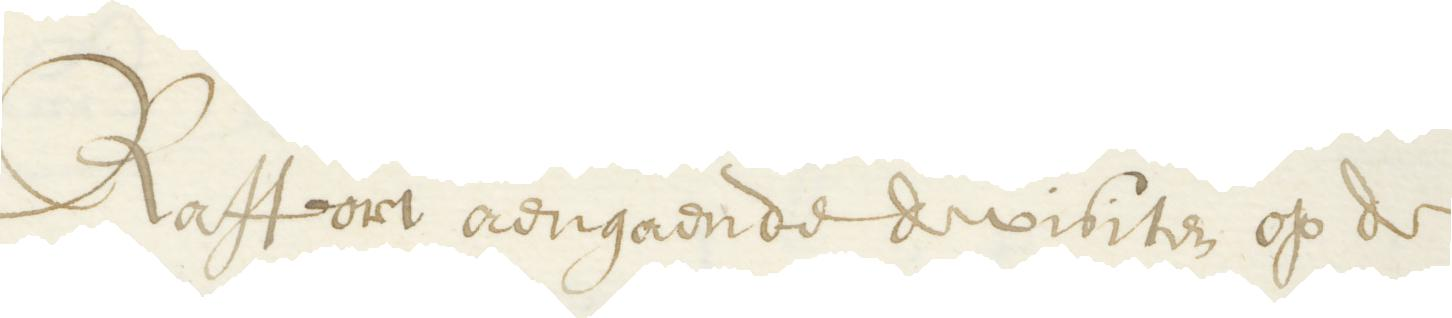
Rapport aengaende devisiten op de
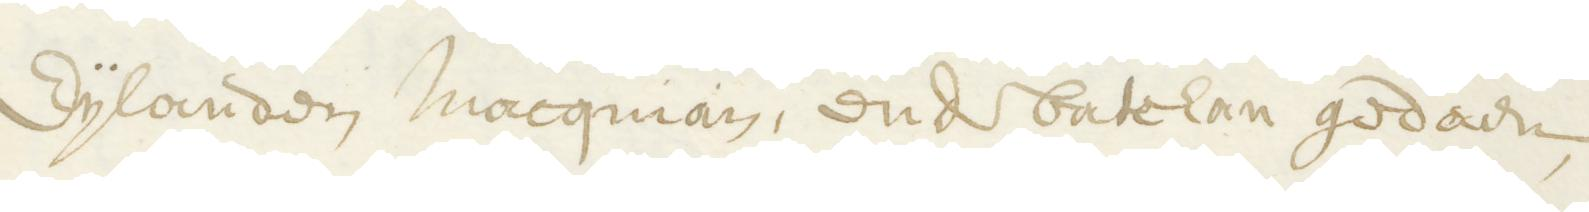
Eijlanden macquian, ende batchan gedaen,
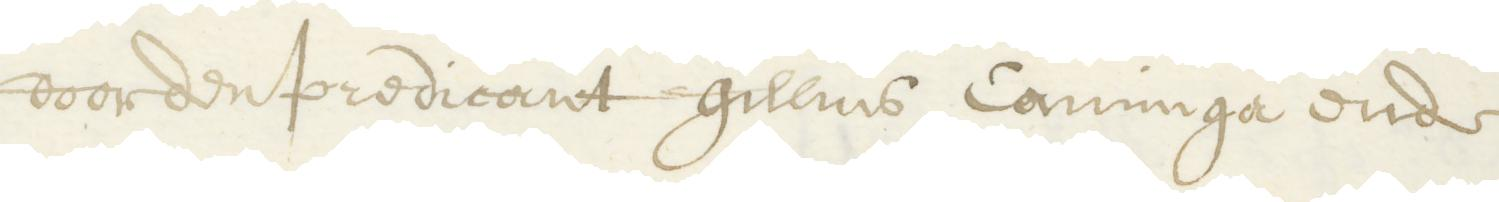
door den predicant gillius Caminga ende
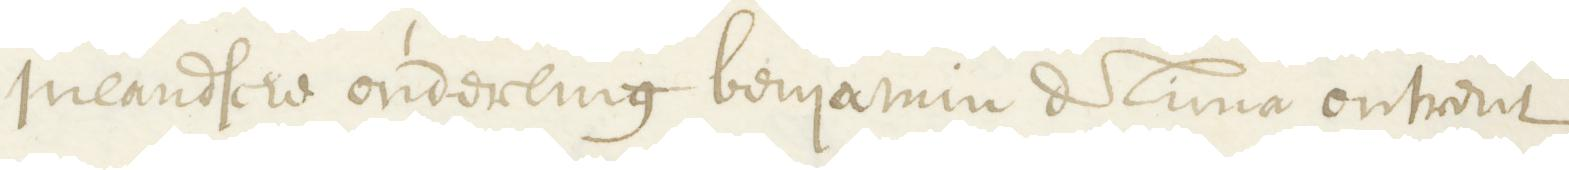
jnlandsche ouderling benjamin delima ontrent
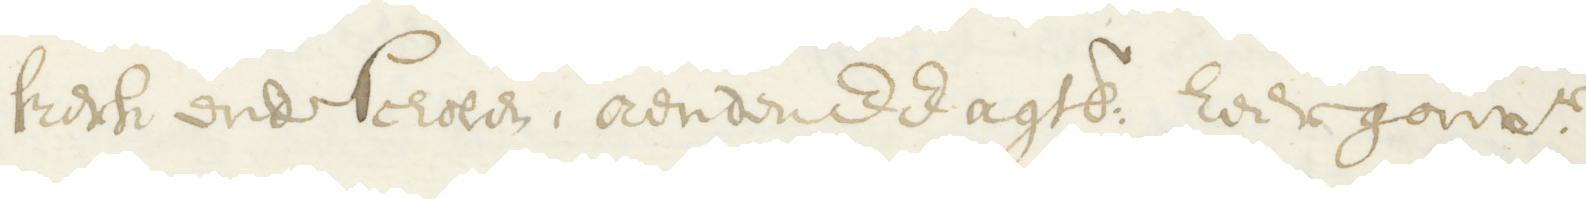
kerk ende scholen, aen den EE agtb:' heer gouv:r
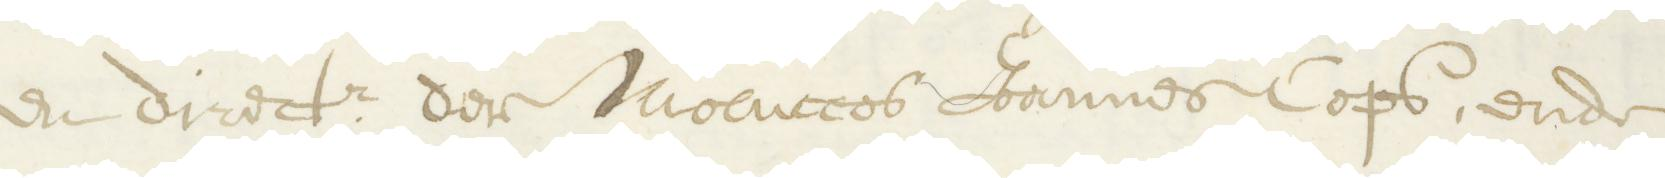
en direct:r der Moluccos Ioannes Cops, ende
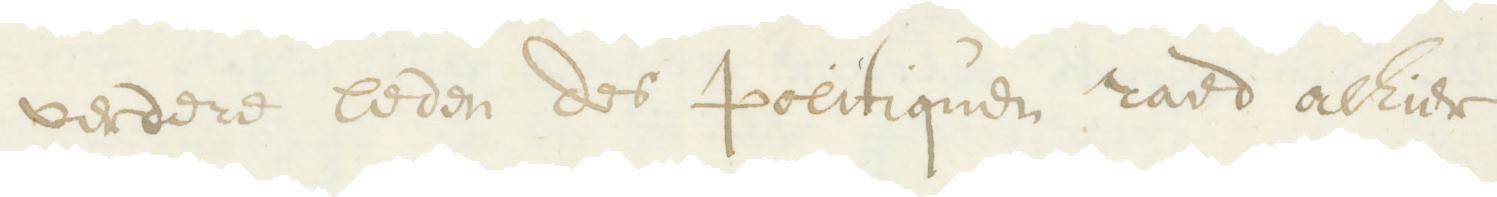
verdere leden des politiquen raed alhier
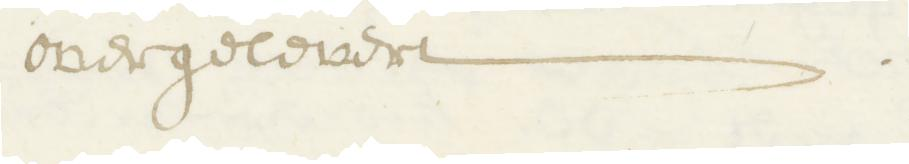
overgelevert.
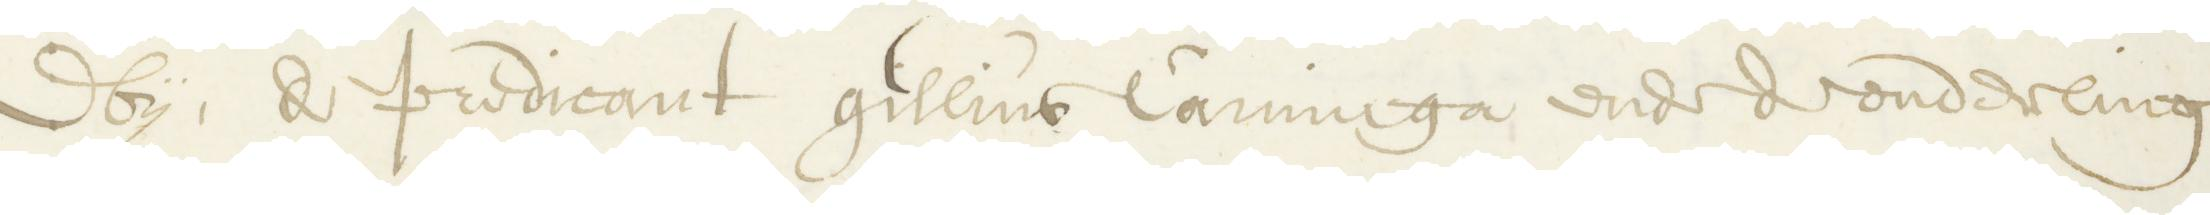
Wij, de predicant gillius Caminga ende de ouderling
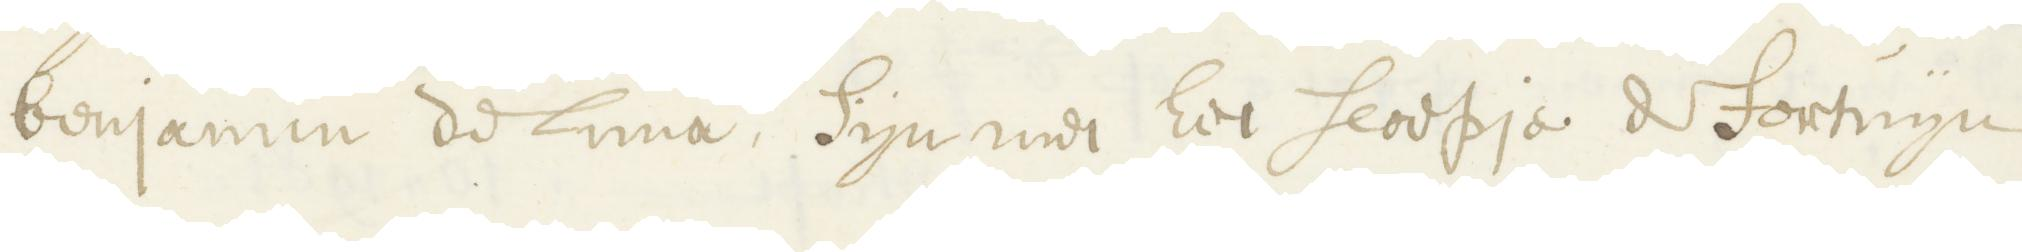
benjamin de lima, sijn met het sloepje de fortuijn
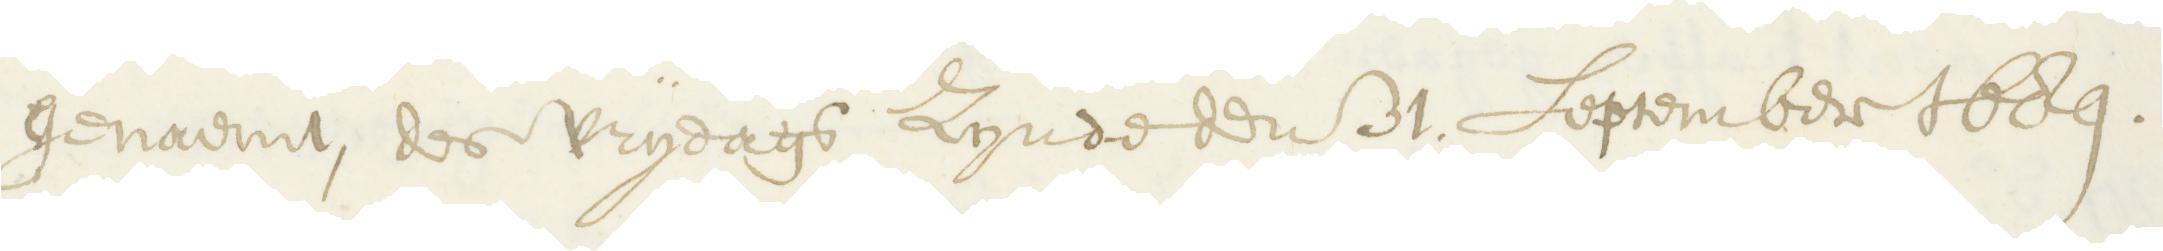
genaemt, des vrijdags zijnde den 31. september 1689.
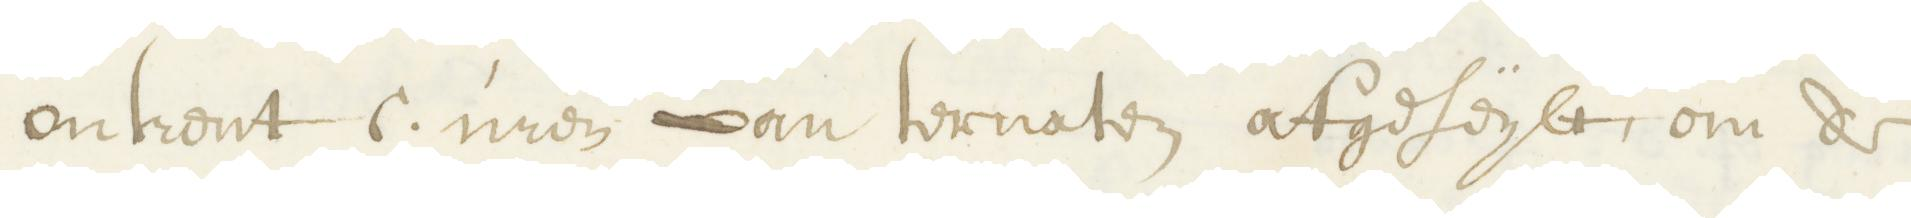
ontrent 5. uren van ternaten afgeseijlt, om de
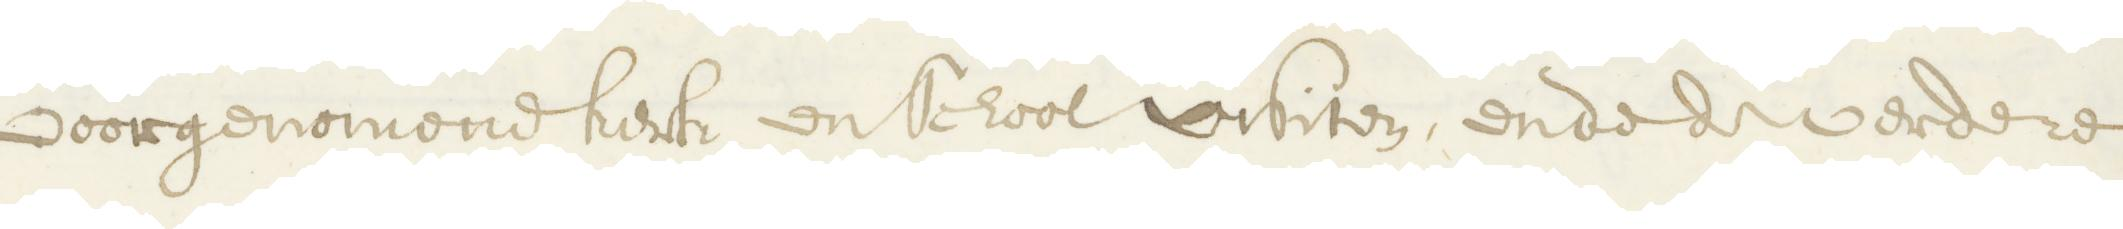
voorgenomene kerk en school visiten, ende de verdere
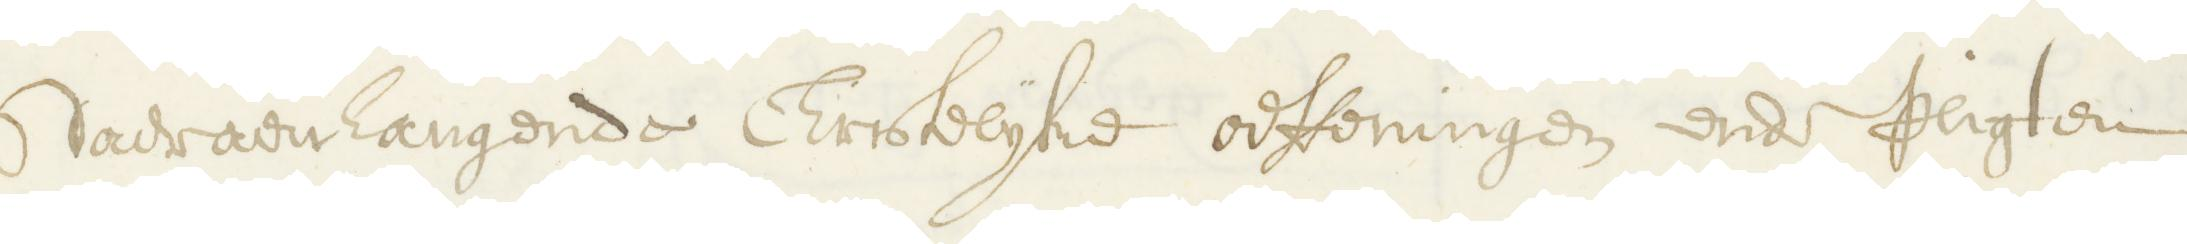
daer aen hangende christelijke oeffeningen ende pligten
